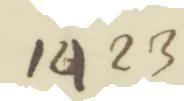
1423
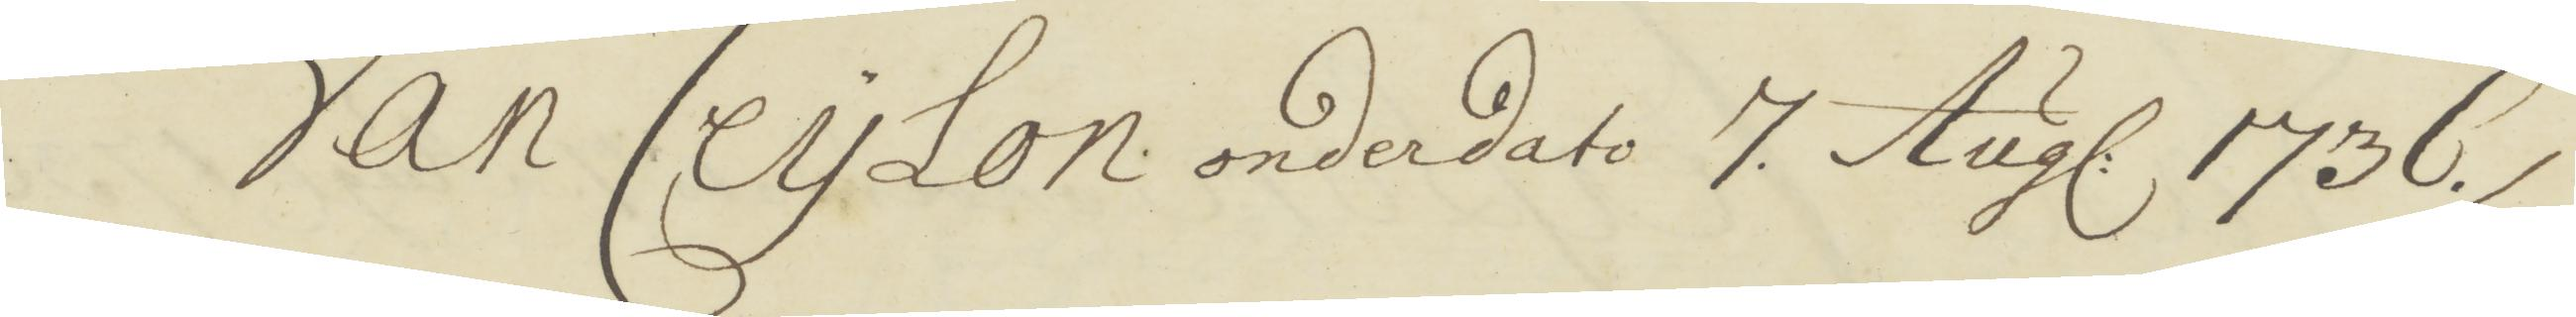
Van Ceijlon onderdato 7. Aug: 1736.
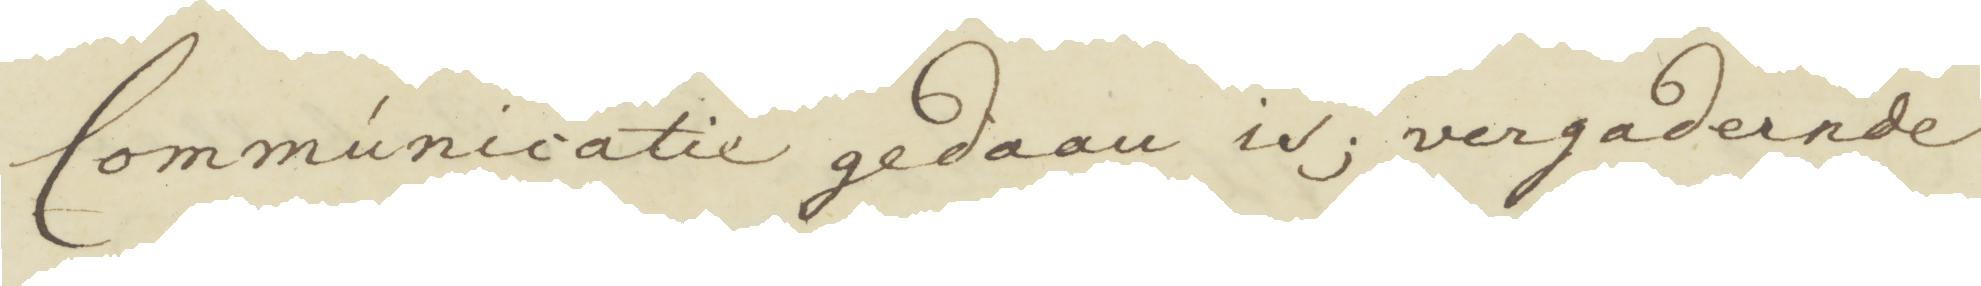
Communicatie gedaan is; vergadernde
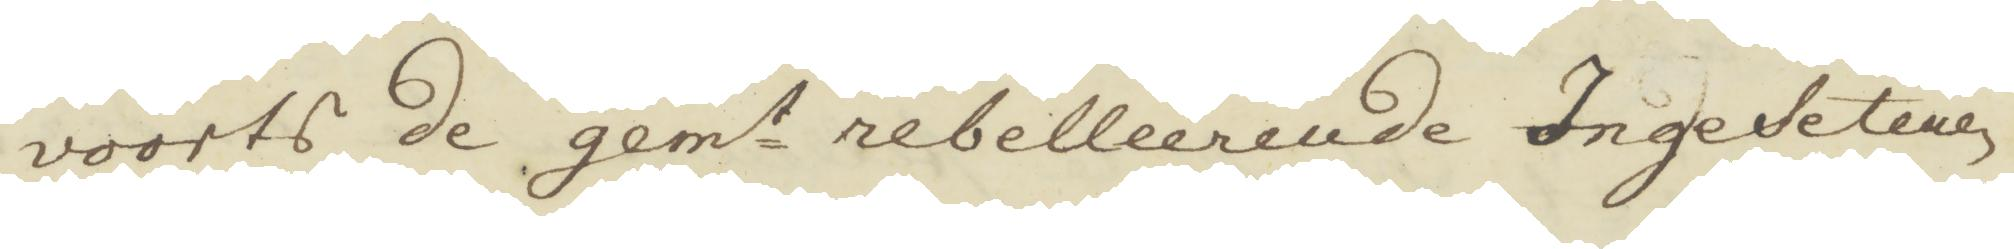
voorts de gem=t rebelleerende Ingesetenen
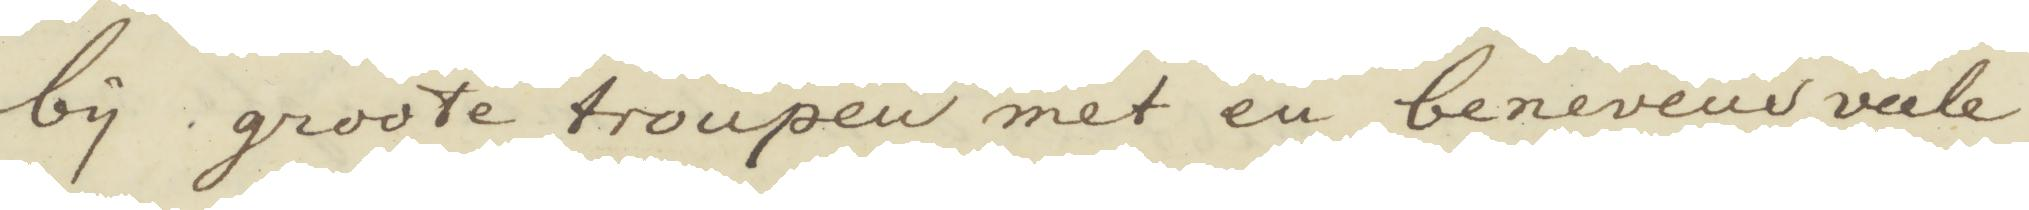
bij groote troupen met en benevens veele
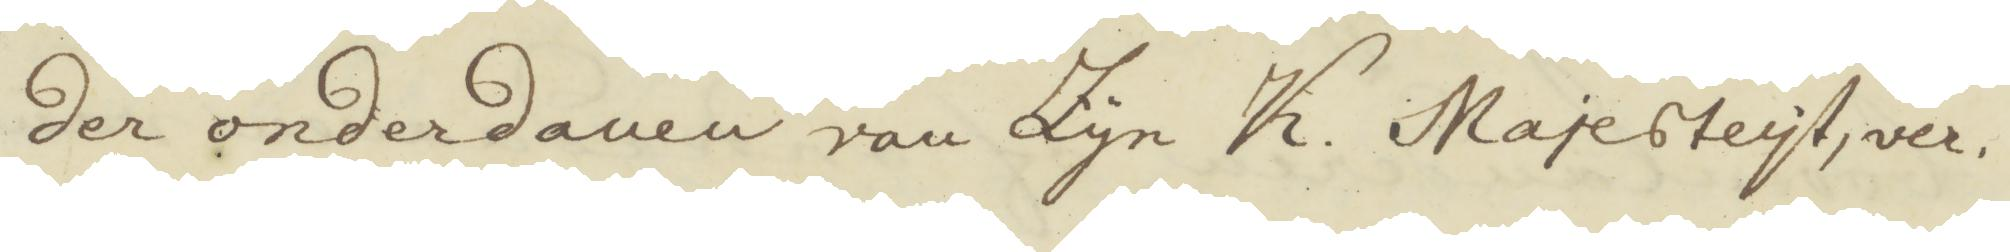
der onderdanen van zijn K: Majesteijt, ver„
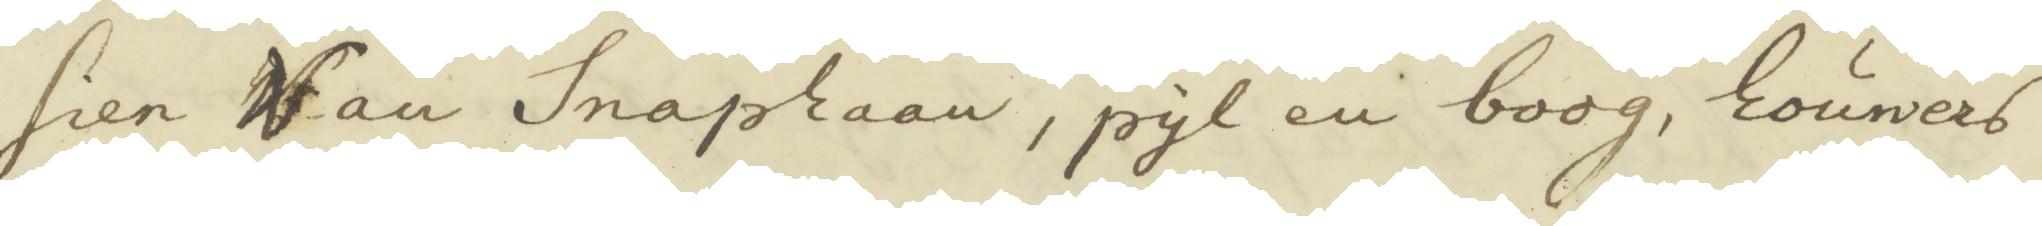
sien Van snaphaan, pijl en boog, houwers
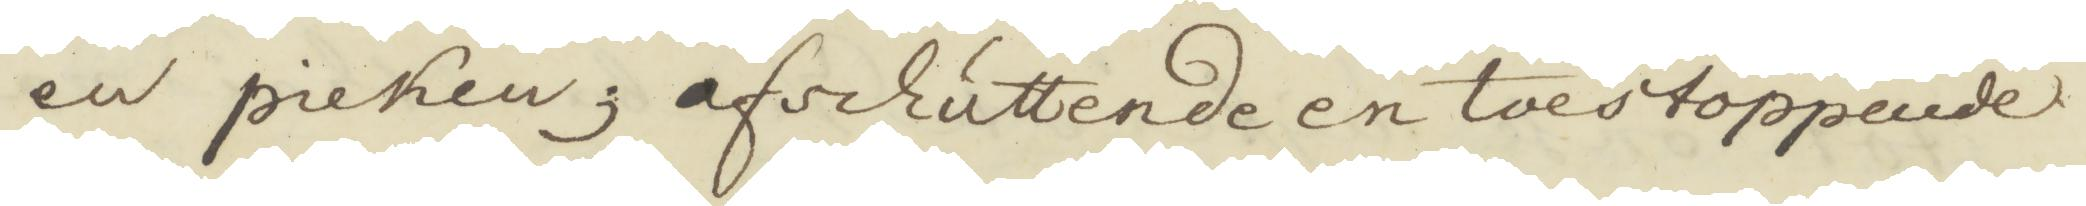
en pieken; afschuttende en toestoppende
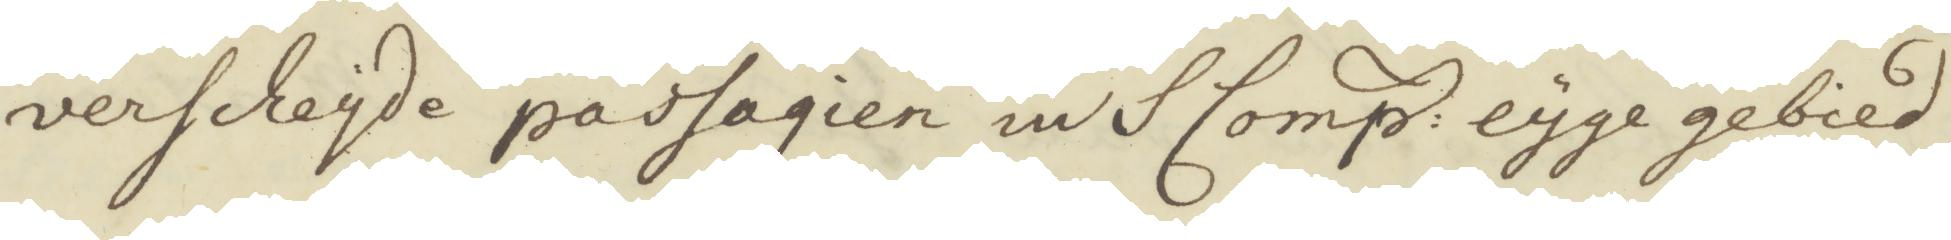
verscheijde passagien in s Comp: eijge gebied
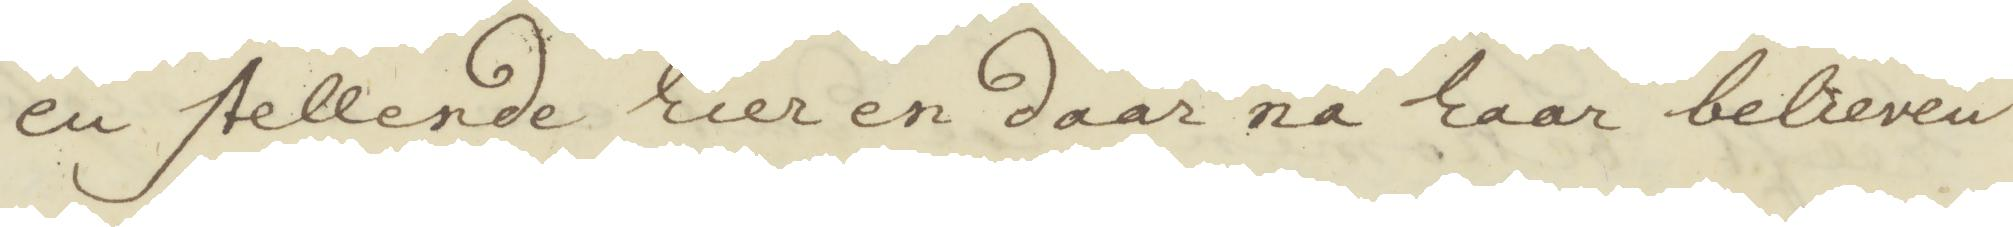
en stellende hier en daar na haar believen
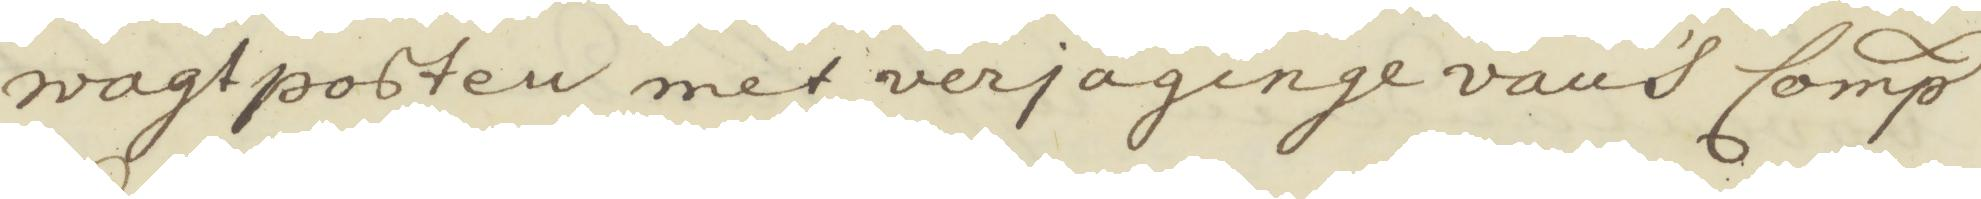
wagtposten met verjaginge van’s Comp
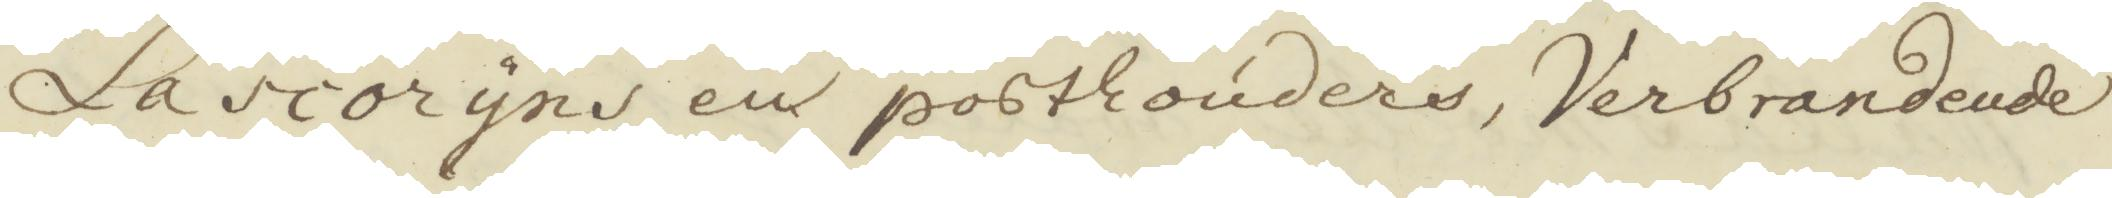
Lascorijns en posthouders, Verbrandende
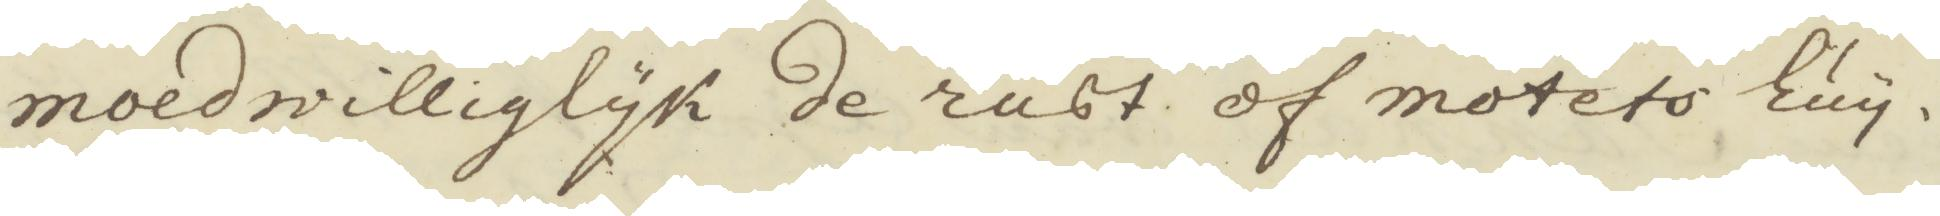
moedwilliglijk de rust of motets huij„
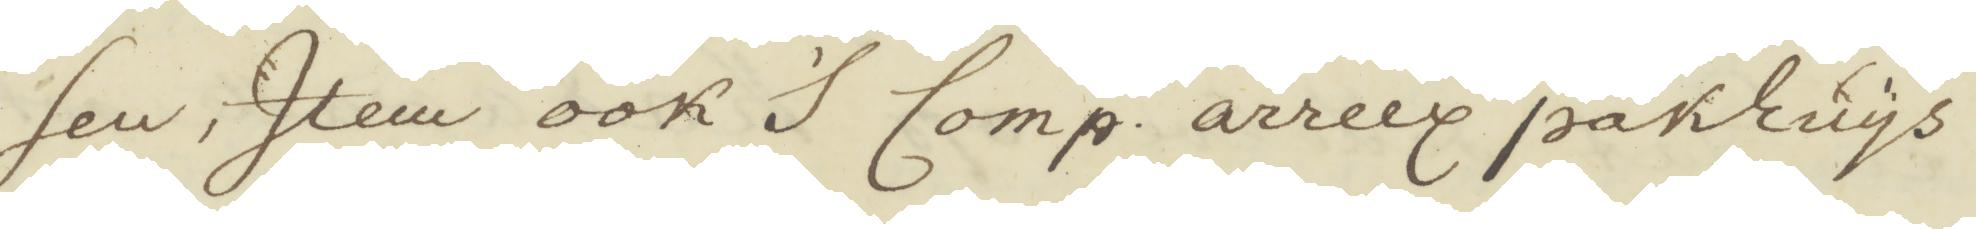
sen, Jtem ook ’s Comp. arreex pakhuijs
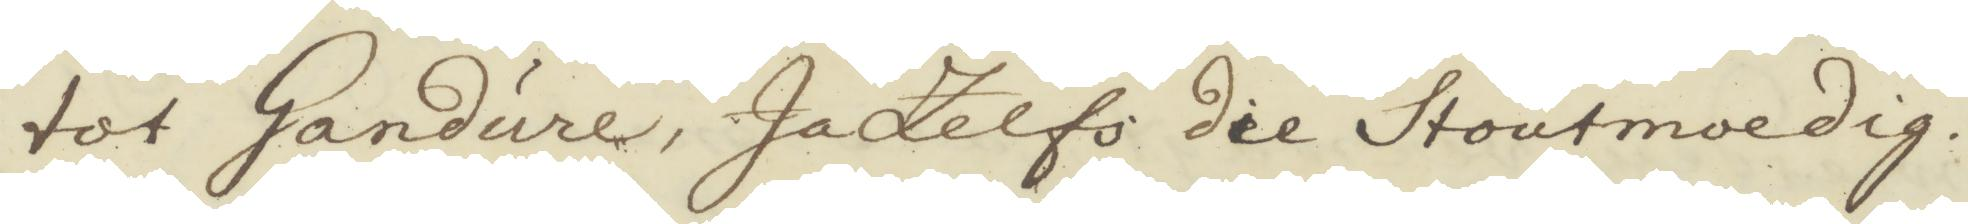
tot Gandure, Ja zelfs die stoutmoedig„
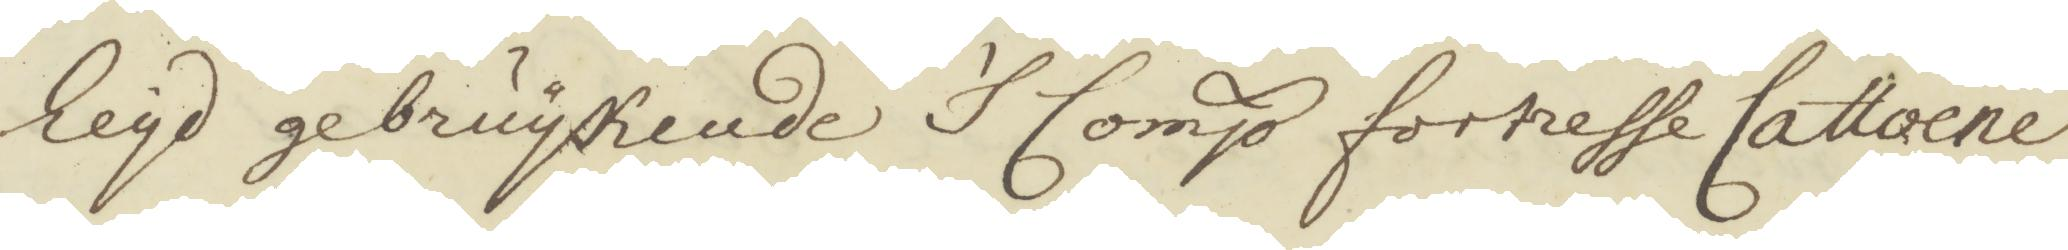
heijd gebruijkende ’s Comp fortresse Cattoene
